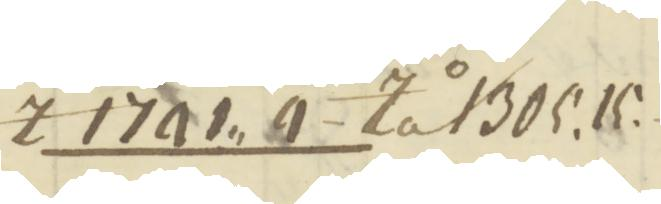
r 1741„4 — rao 1305.15.
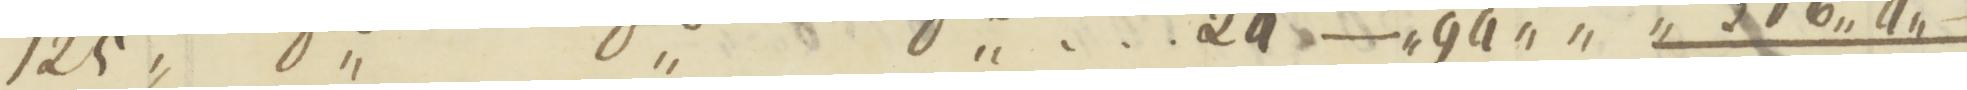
125„ d„o d„o d„o . . . 24 —„ 94 „ „ „ 316„ 4„
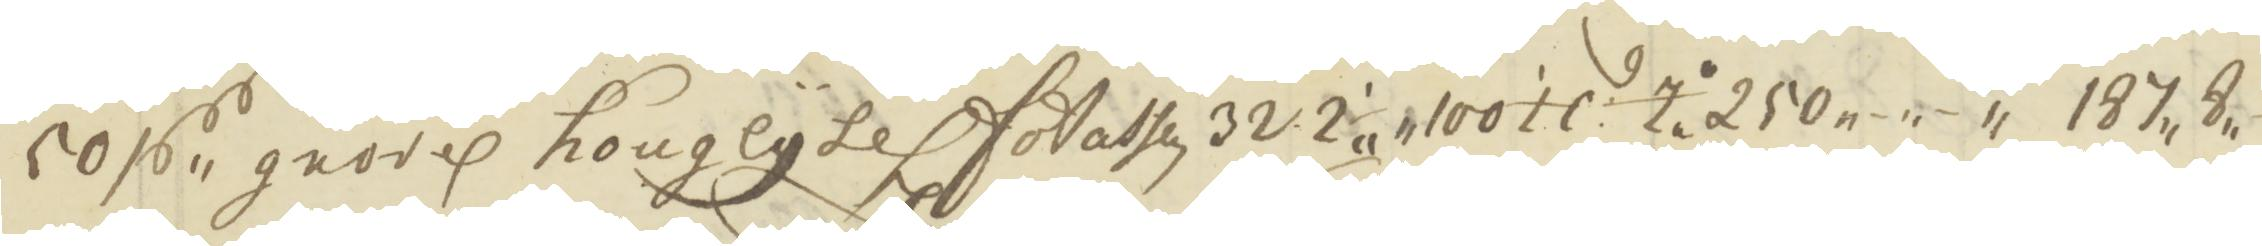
50 p„s grove houglijse fotassen 32. 2¼„ 100 tl:g r„o: 250„—„—„ 187„8„
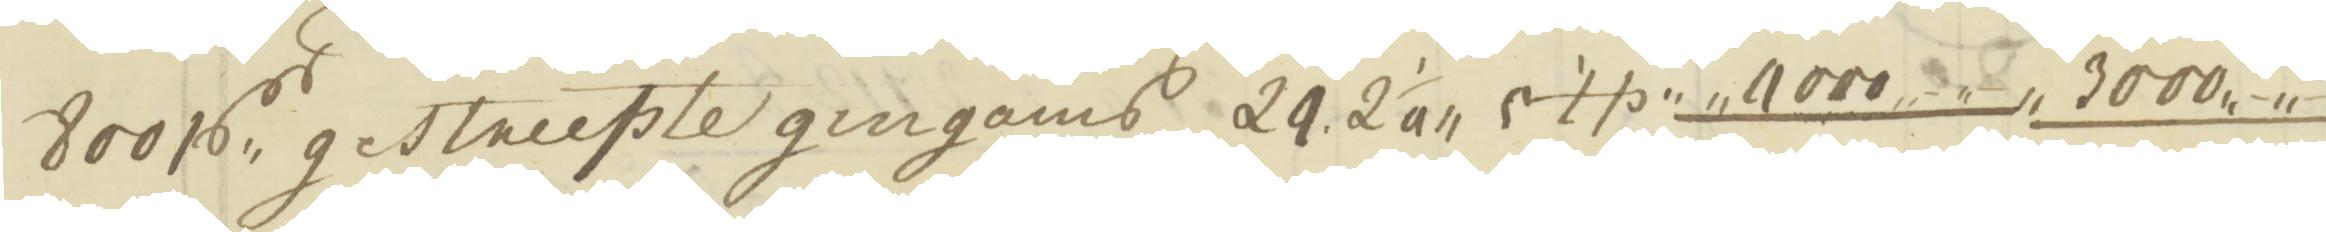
800p„s gestreepte gingams 24. 2¼„ 5 tp„ „ 4000—„—„ 3000„—„
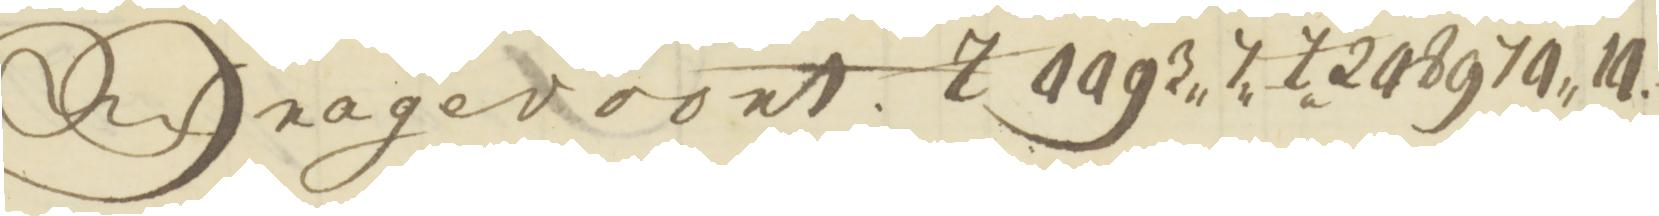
Dragevoort. r 4493„ 7 r„ 248974„14.
